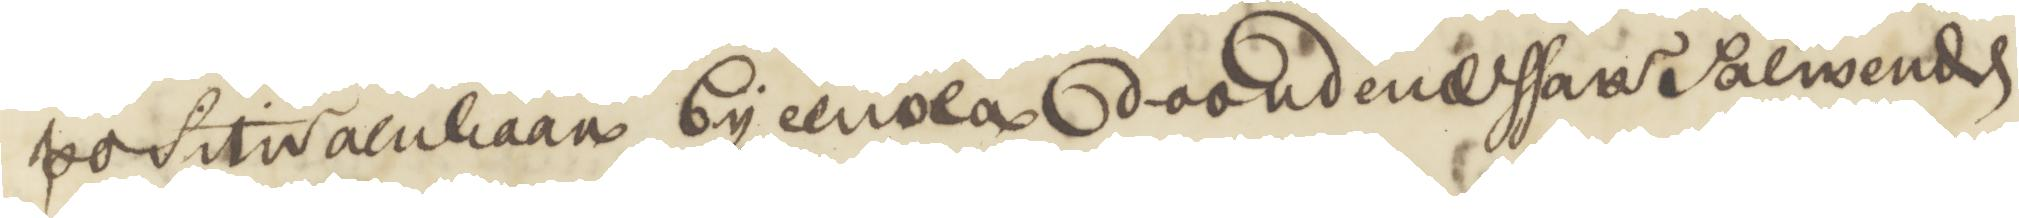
positie aen haar bij een ola doorden dessave Sal werden
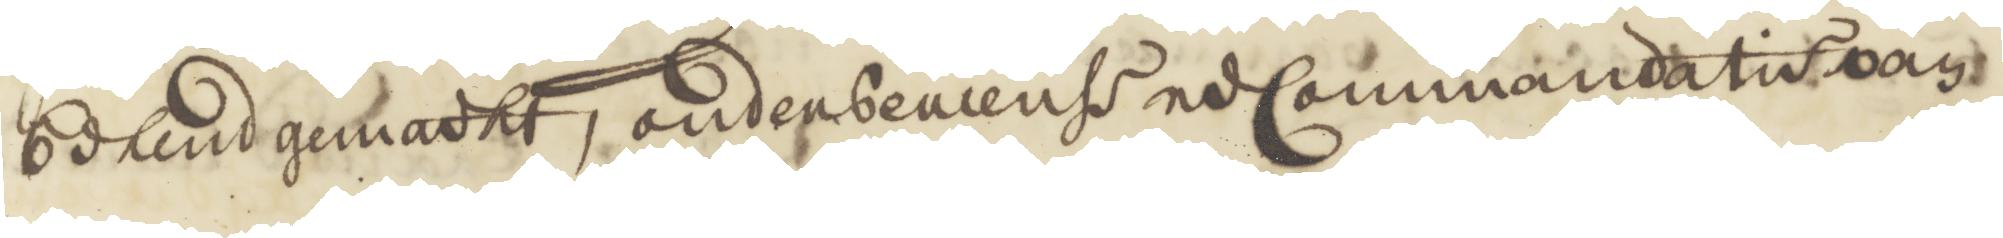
bekend gemaekt, onder serieuse recommandatie van
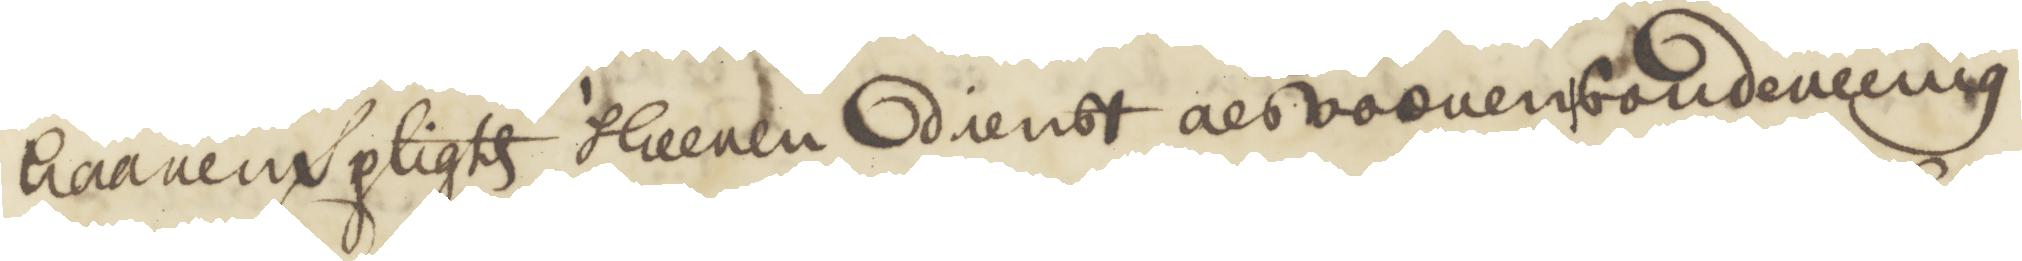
haaren verpligten 'sheeren dienst als vooren/sonder eenig
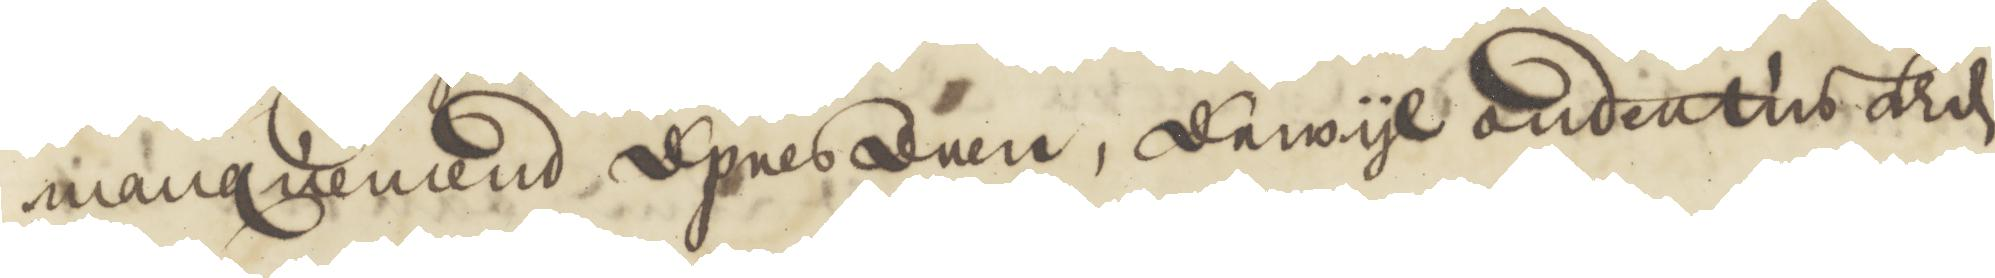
manquemend te presteren, terwijl ondertusschen
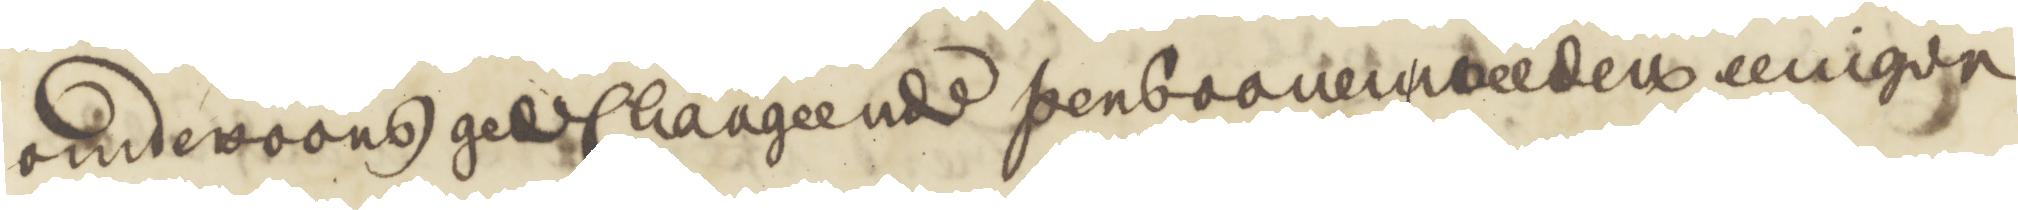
om de voors gedechargeende persoonen/weeder eeniger
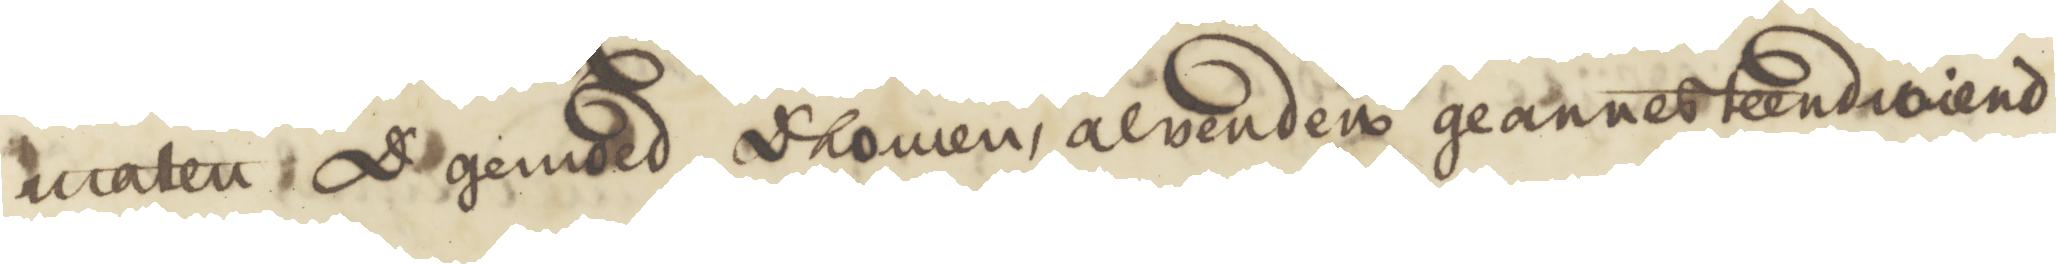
maten, te gemoed te komen, alverder gearresteerd wierd
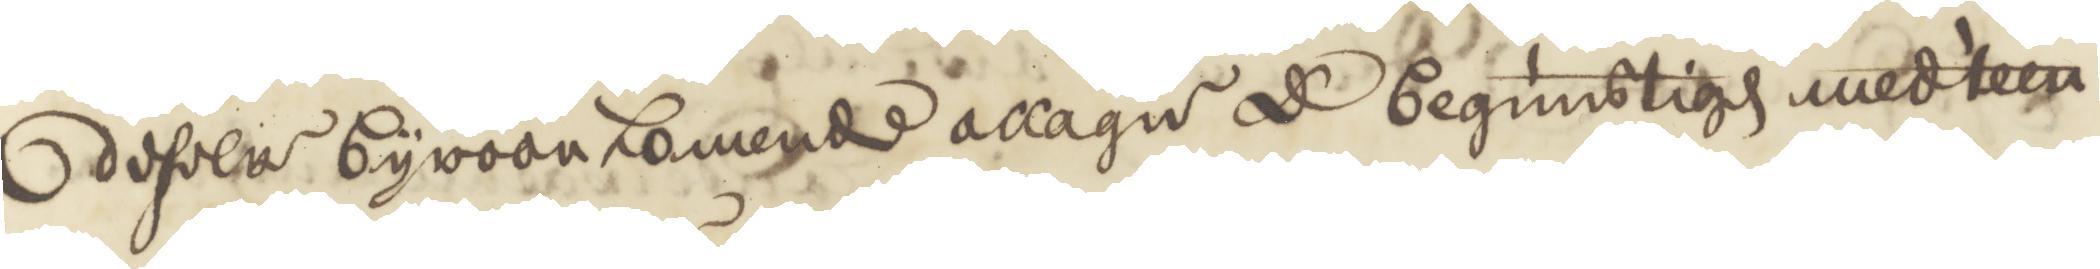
deselve bij voor komende occagie te begunstigen med ´t een
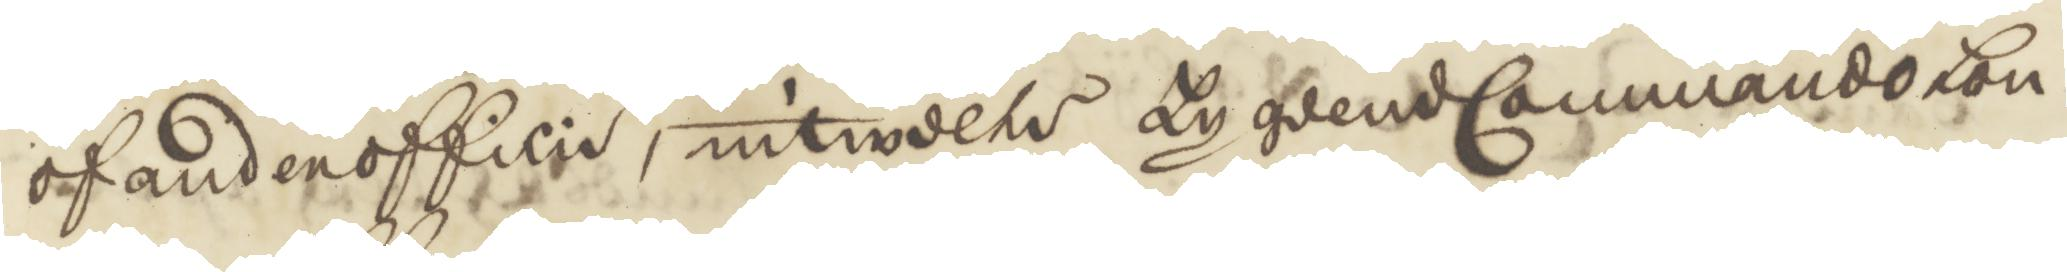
of ander officie, in'twelke Zy geene Commando kon
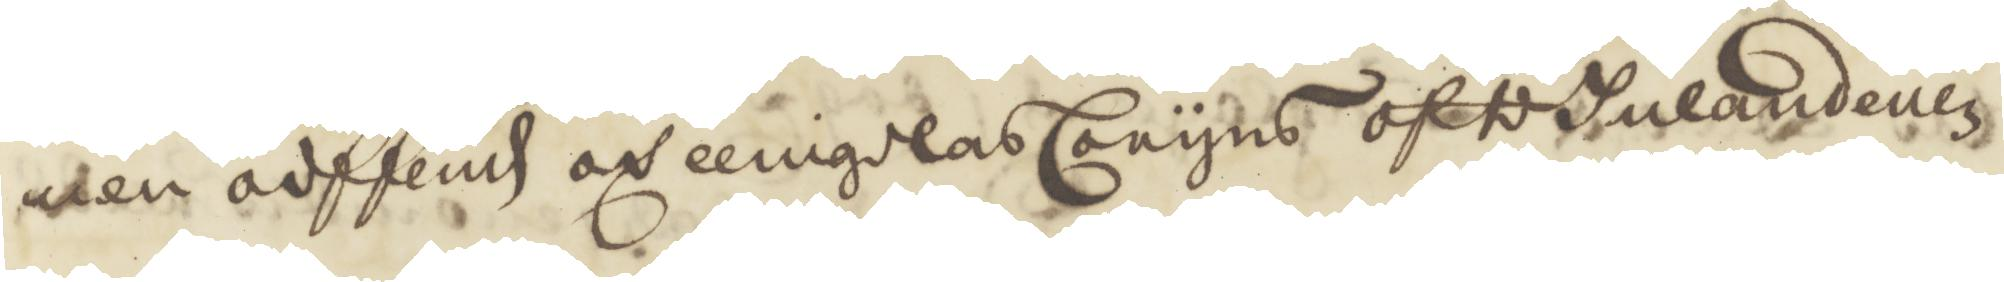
nen oeffenen over eenige lascorijns of te Inlanderen
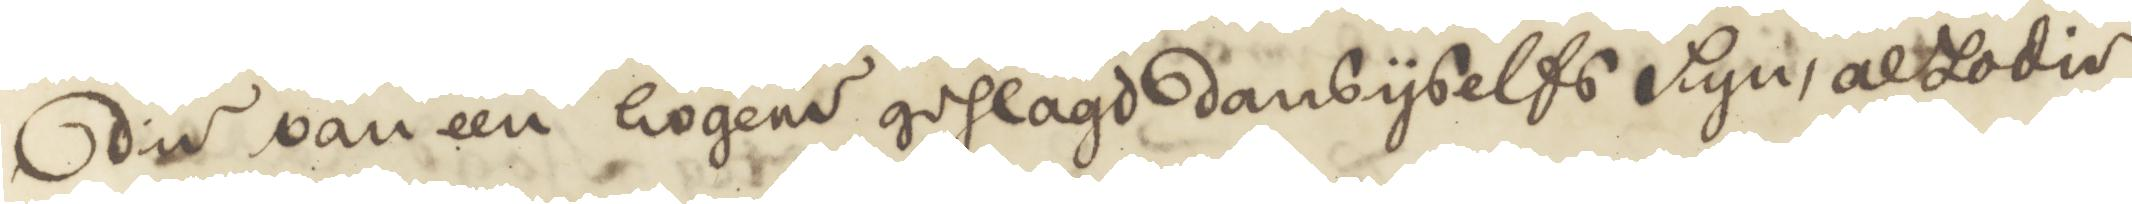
die van een hogere geslagd dan sijselfs Syn, alzo die
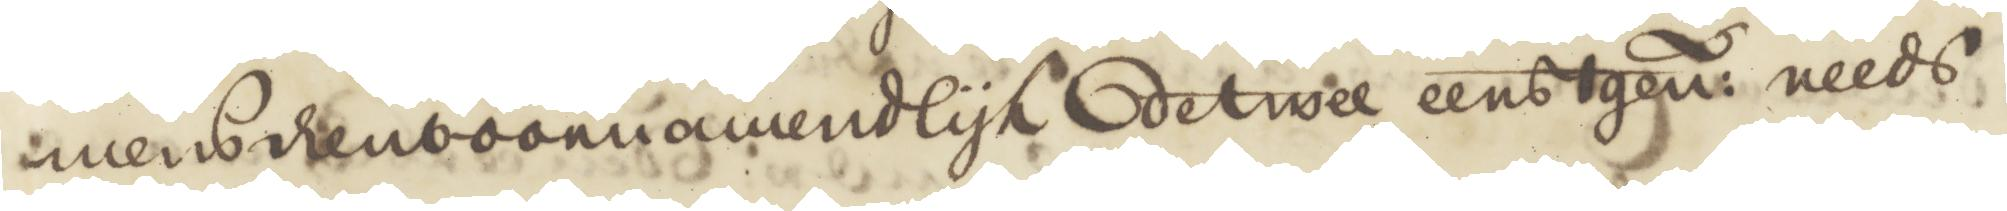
menschen voornamendlijk de twee eerstgen: reeds
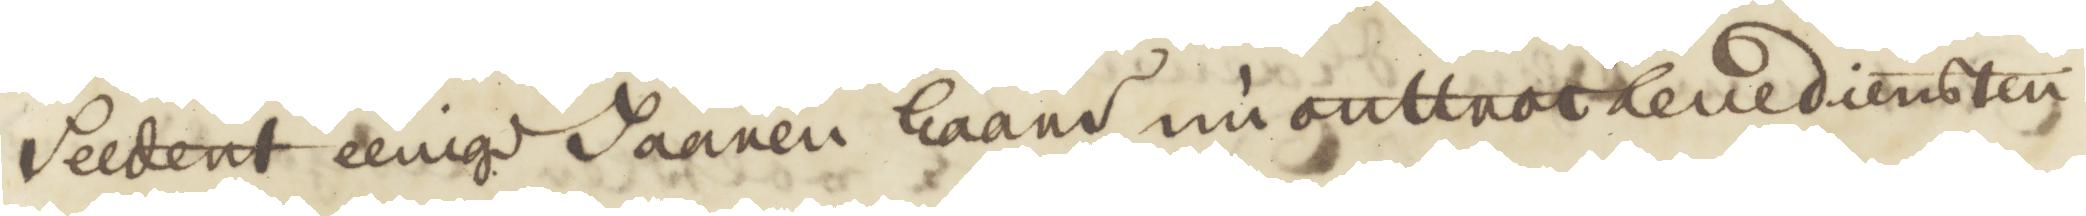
Seedert eenige Iaaren haare nu onttrockene diensten
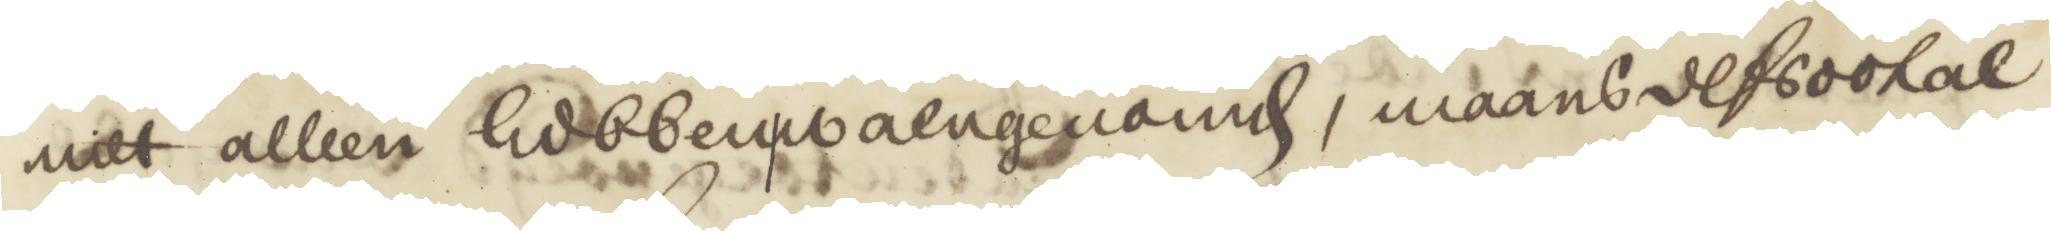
niet alleen hebben/waergenomen, maar selfs ook al
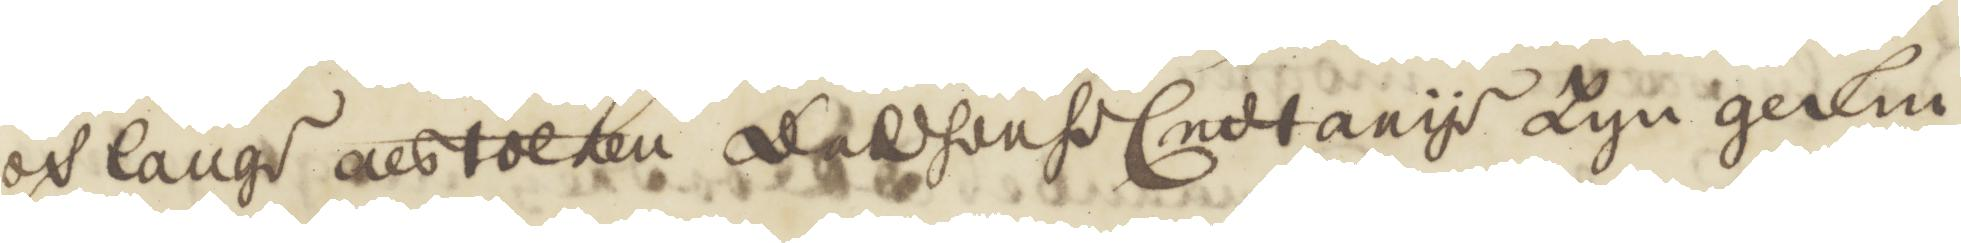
over lange als tolken ter deser secretarije Zyn geem
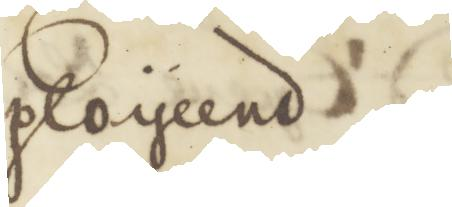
ploijeerd
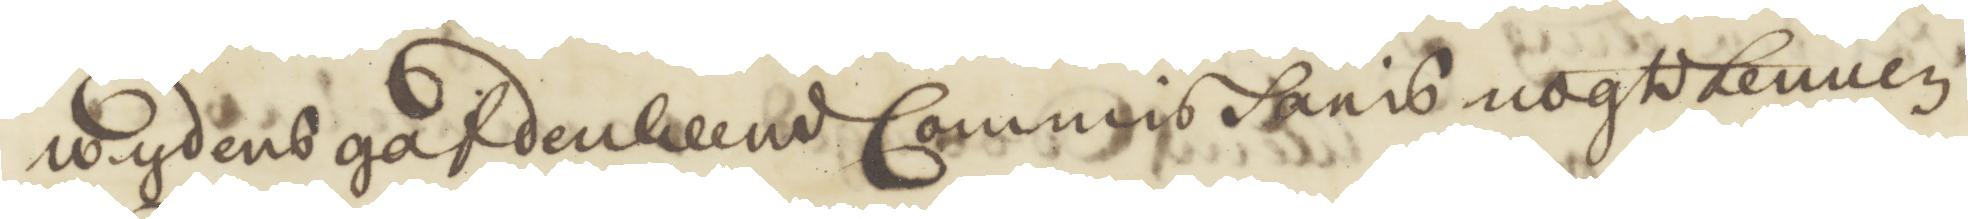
wyders gaf den heere Commissaris nog te kennen
